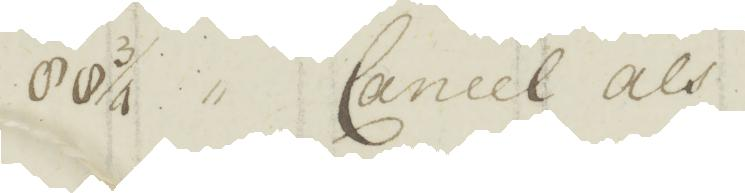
88¾ „ Caneel als
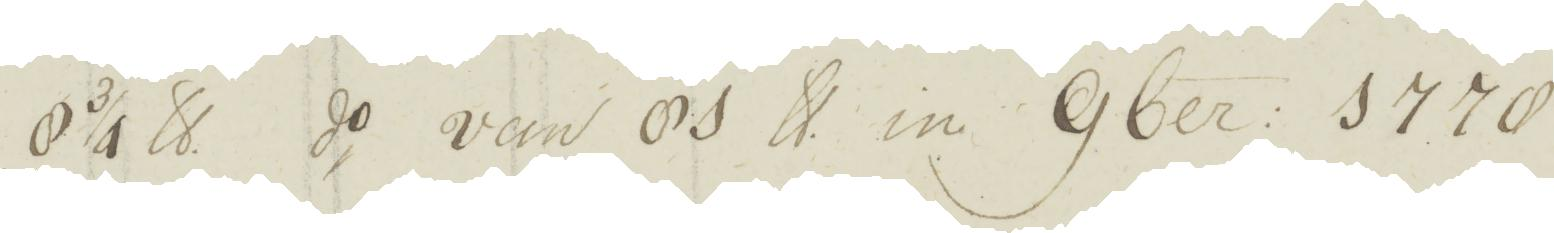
8¾ lb. d„o van 81 lb. in 9ber: 1778
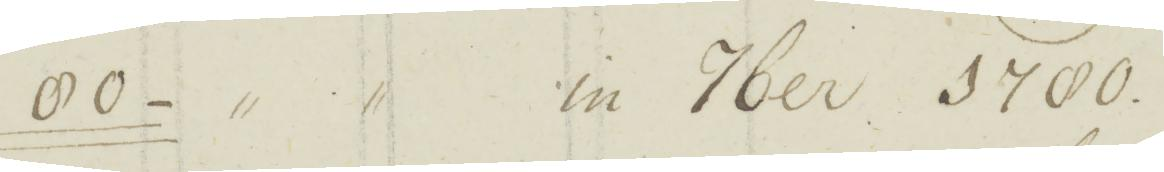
80 - „ „ in 7ber 1780.
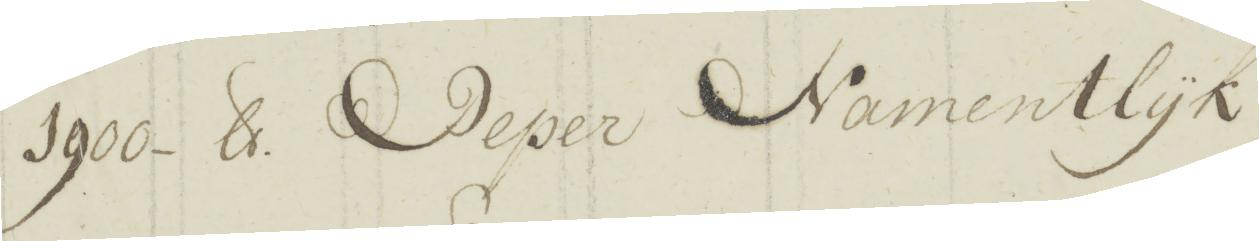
1900- lb. Peper Namentlijk
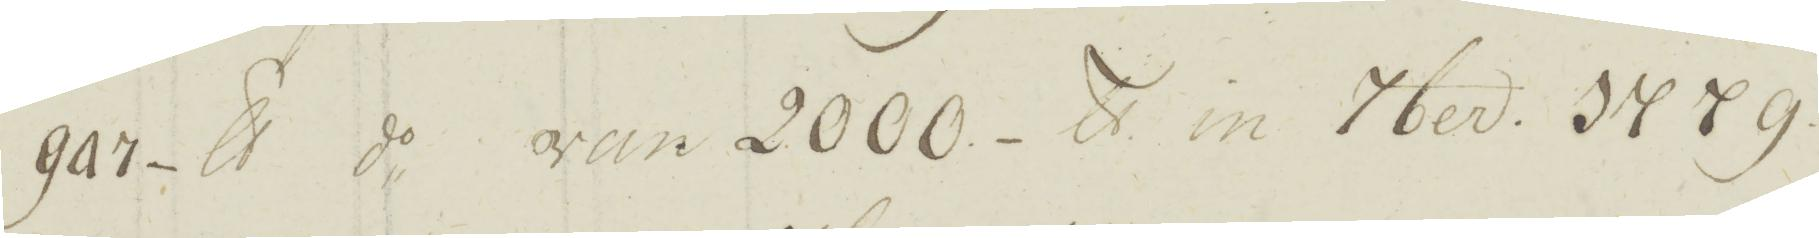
947- lb d„o van 2000.- lb. in 7ber. 1779.
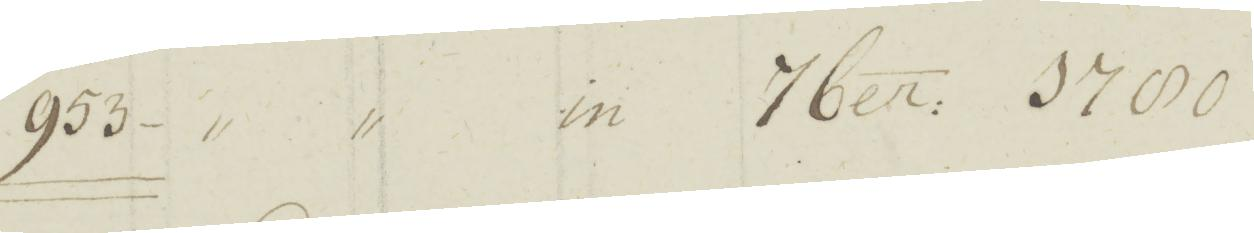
953- „ „ in 7ber: 1780
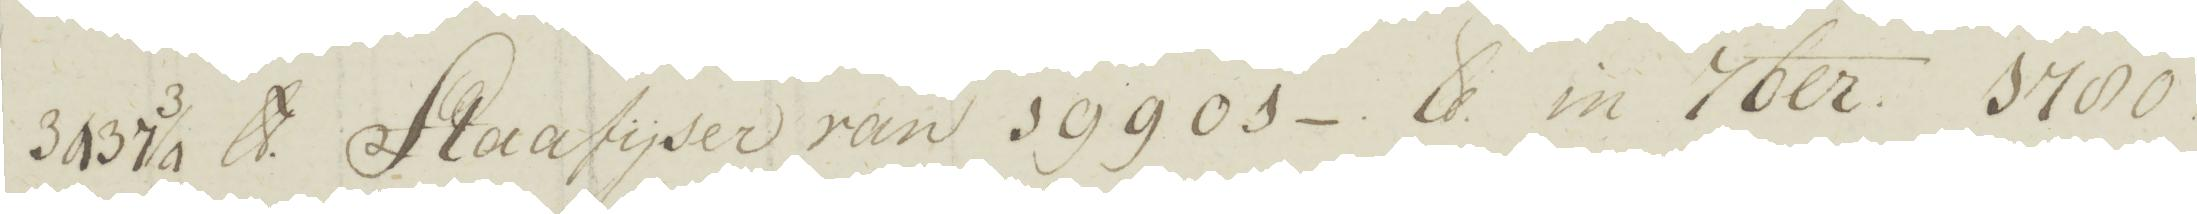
3437¾ lb. Staafijser van 19901-. lb in 7ber. 1780
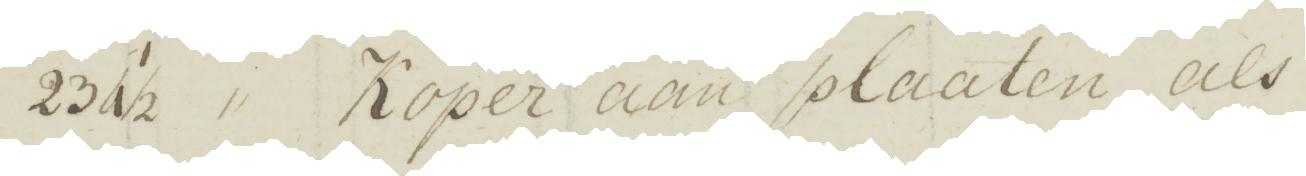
234½ „ Koper aan plaaten als
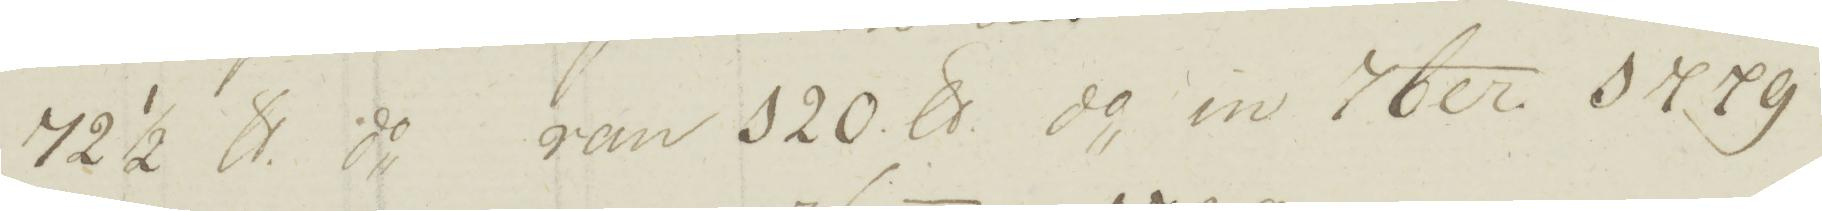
72½ lb. d„o van 120. lb. d„o in 7ber. 1779
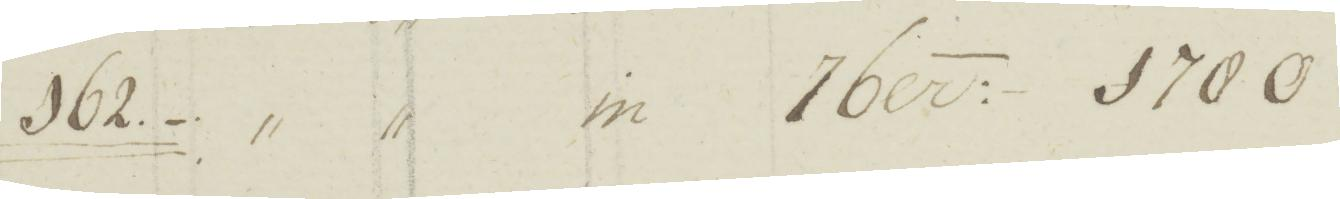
162.-. „ „ in 7ber: 1780
